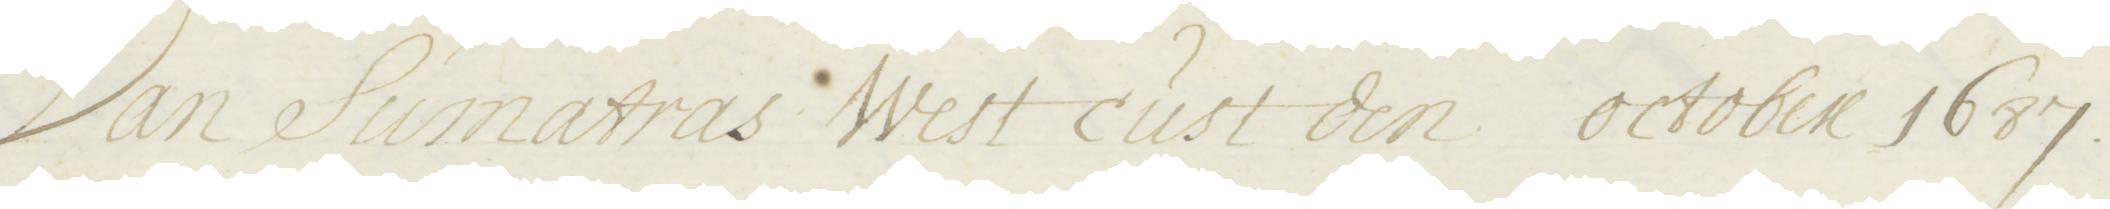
Van Sumatras West Cust den October 1687.
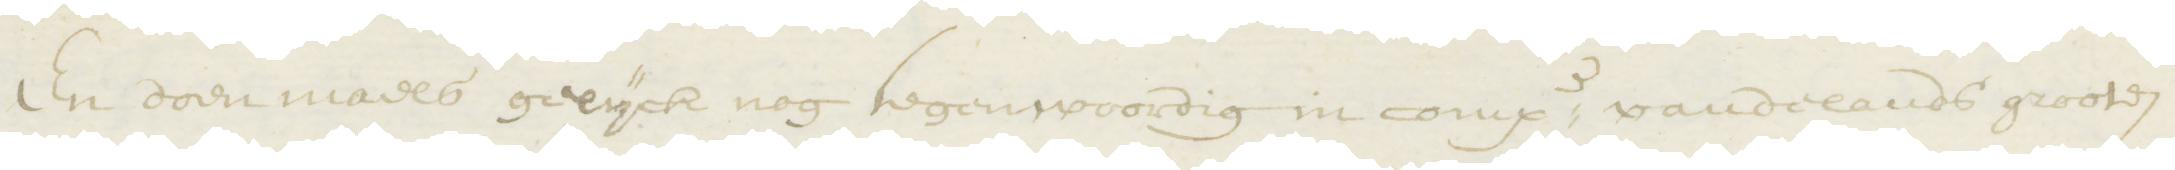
En doen maels gelijck nog tegenwoordig in comp:e vandelands grooten
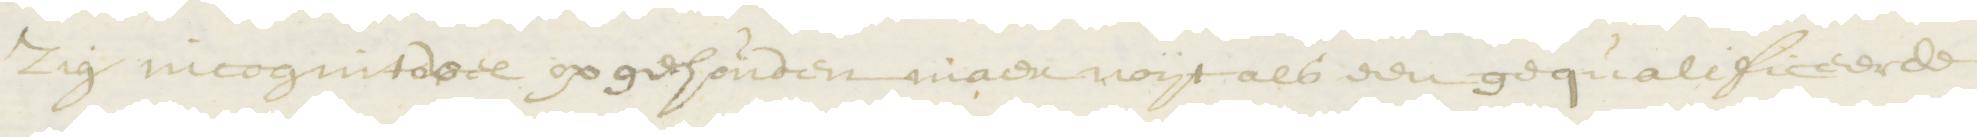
Zig incognitowel op gehouden maer noijt als een gequalificeerde
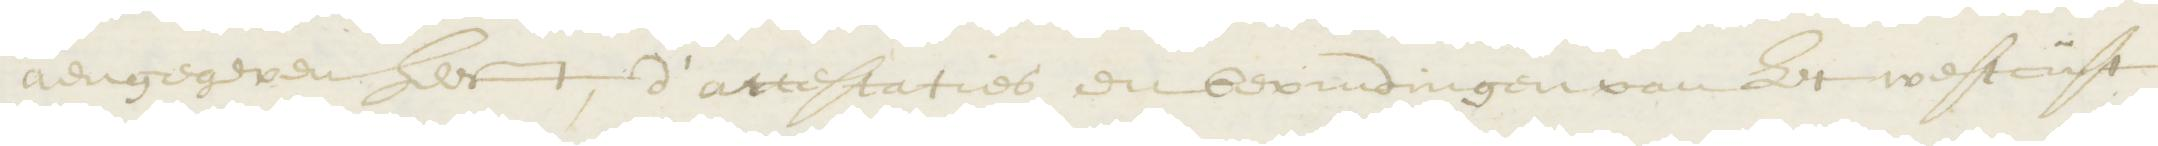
aengegeven heeft, d’ attestaties en bevindingen van het westcust
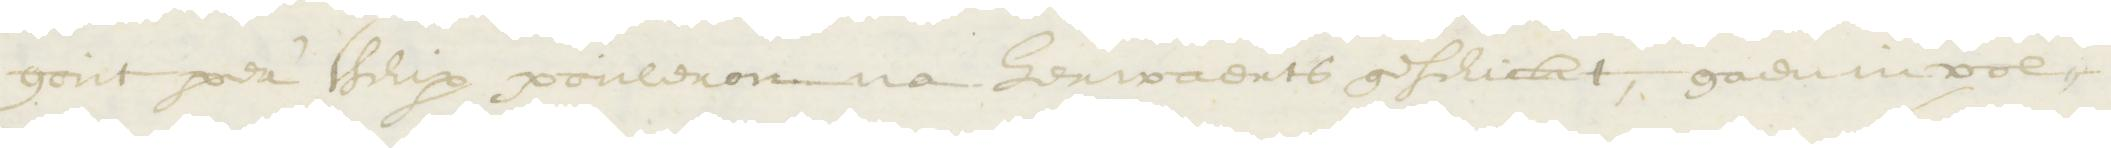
gout per schip pouleron na herwaerts geschickt, gaen in vol„
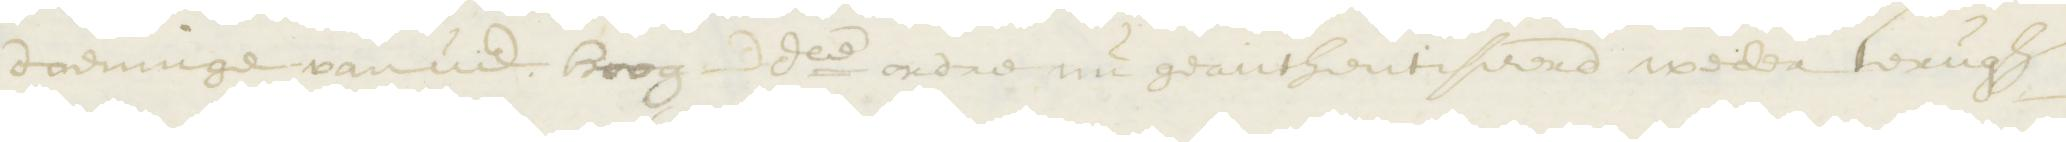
doeninge van UE. hoog Ed=le ordre nu geauthentiseerd weder terugh
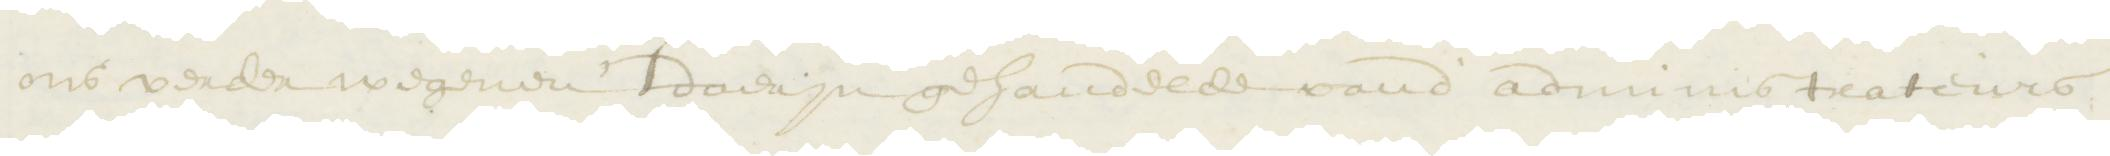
ons verder wegenen 'tdaerjn gehandelde vand’ administrateurs,
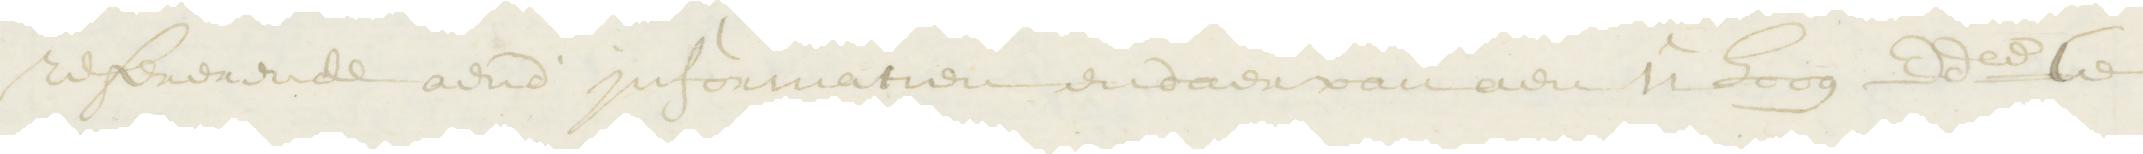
refererende aend' jnformatien endaer van aen u Hoog Ed=le te
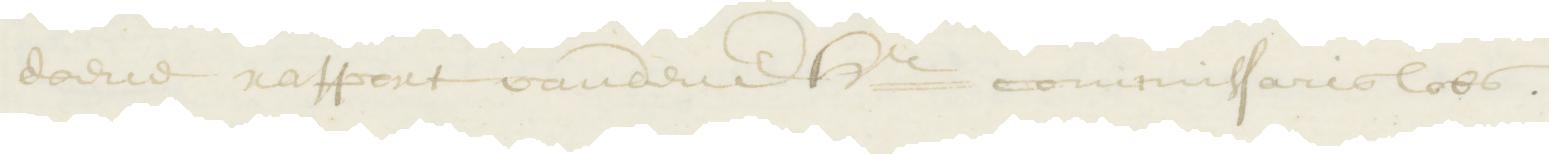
doene rapport van den EH=r commissaris Cobs.
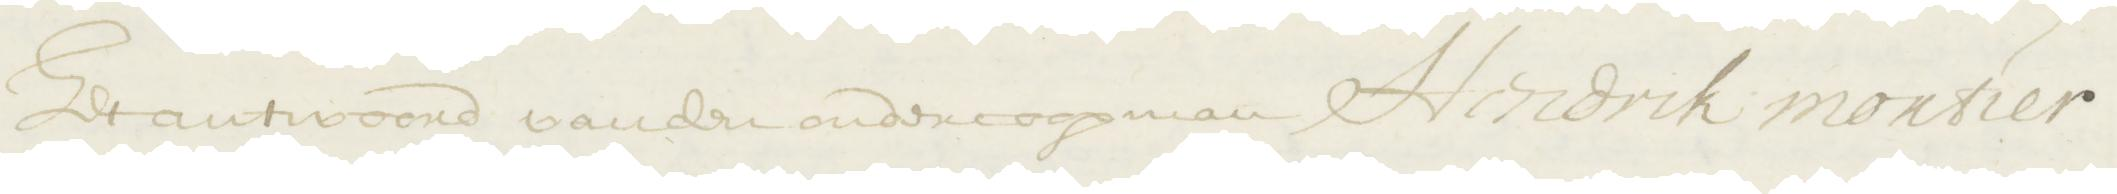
Het antwoord van den ondercoopman Hendrik Mortier
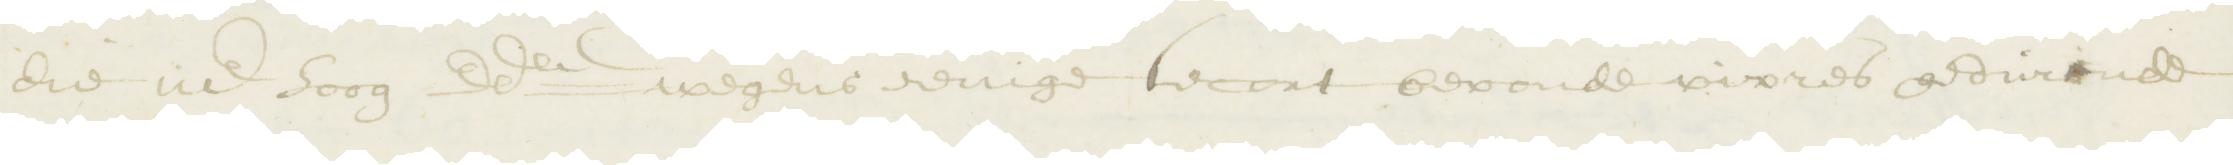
die uE Hoog Ed=le wegens eenige tecort bevonde vivres gedurende
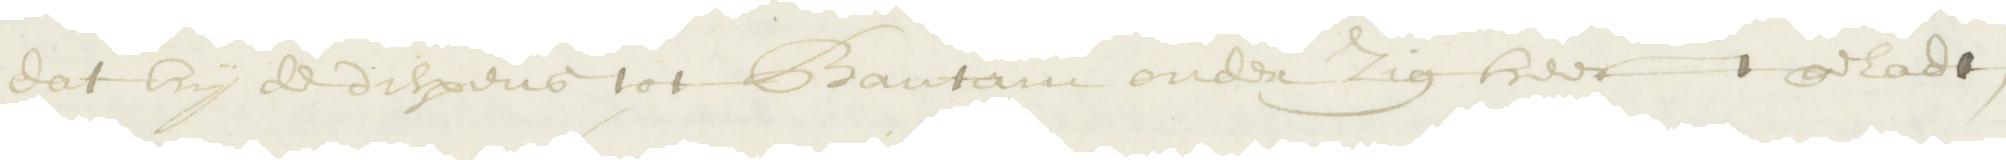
dat hij de dispens tot Bantam onder Zig heeft gehadt,
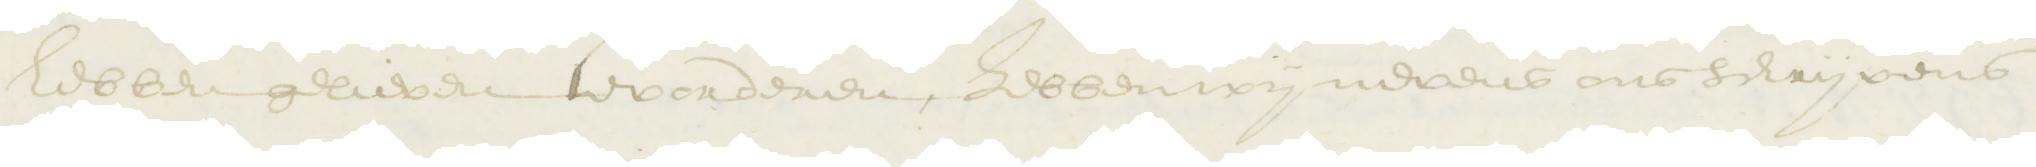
hebben gelieven tevorderen, hebbenwij nevens ons schrijvens
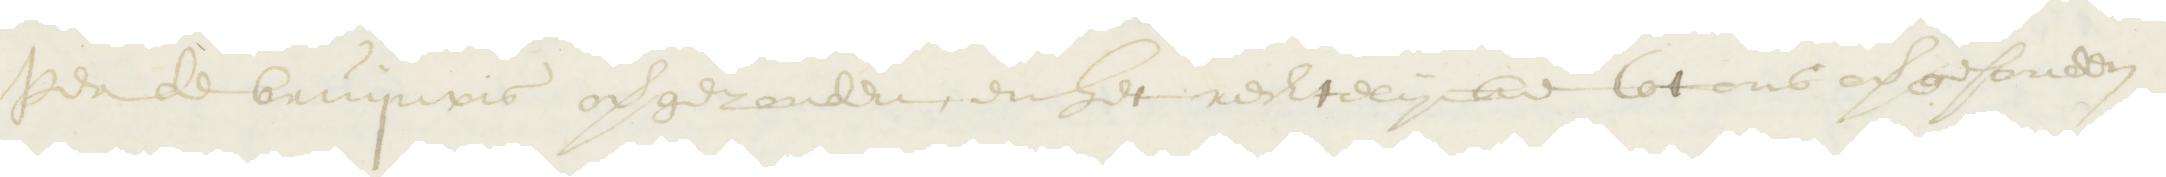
per de bruijnvis overgezonden, en het reghtelijcke tot ons over gesonden
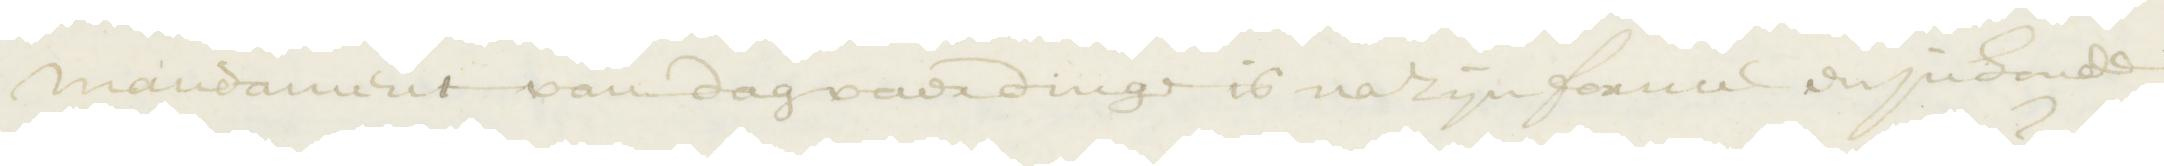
mandament van dagvaerdinge is na zijn forme en jnhoude
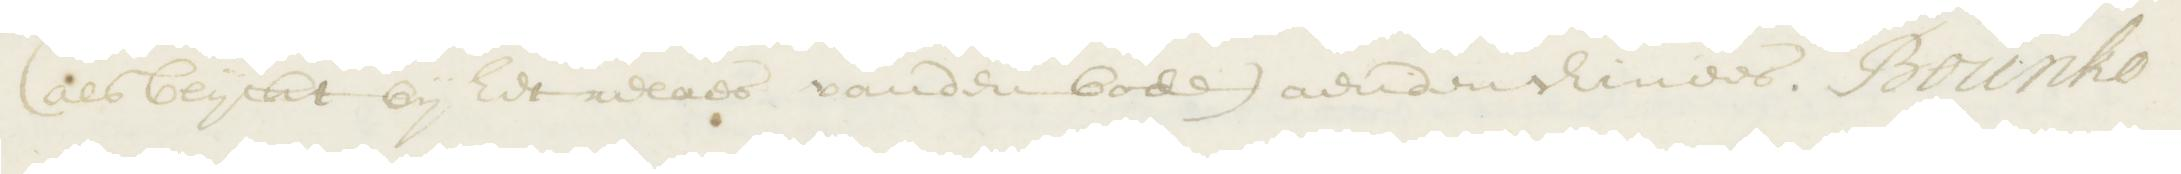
(als blijckt bij het relaes van den bode) aenden chinees. Bounko
